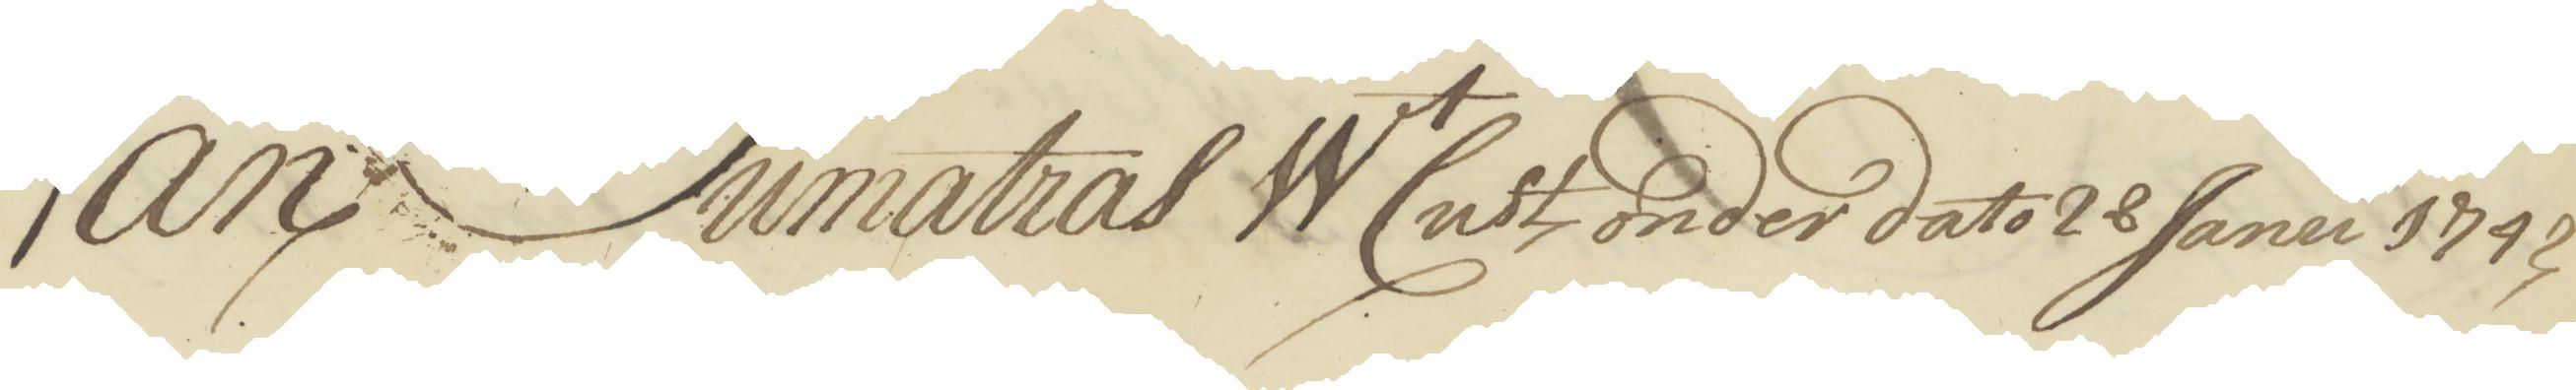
Van Sumatras WtCust onder dato 28 Janu 1742
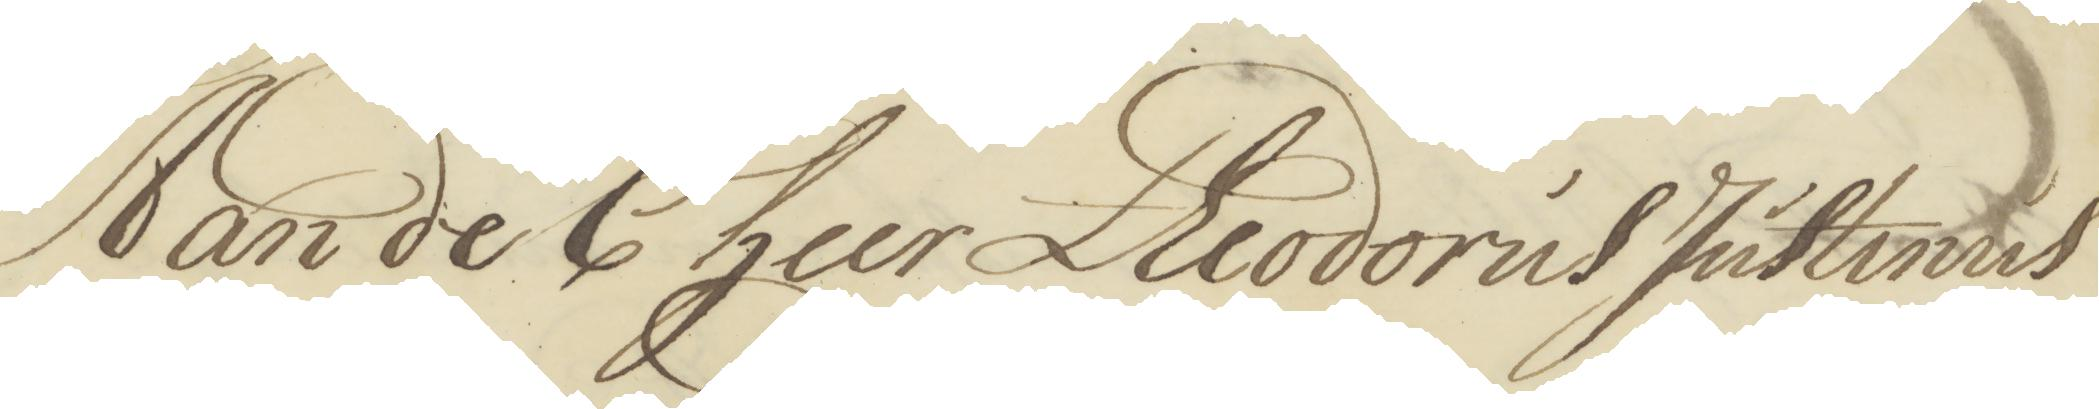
Aan de E Heer Theodorus Justinus
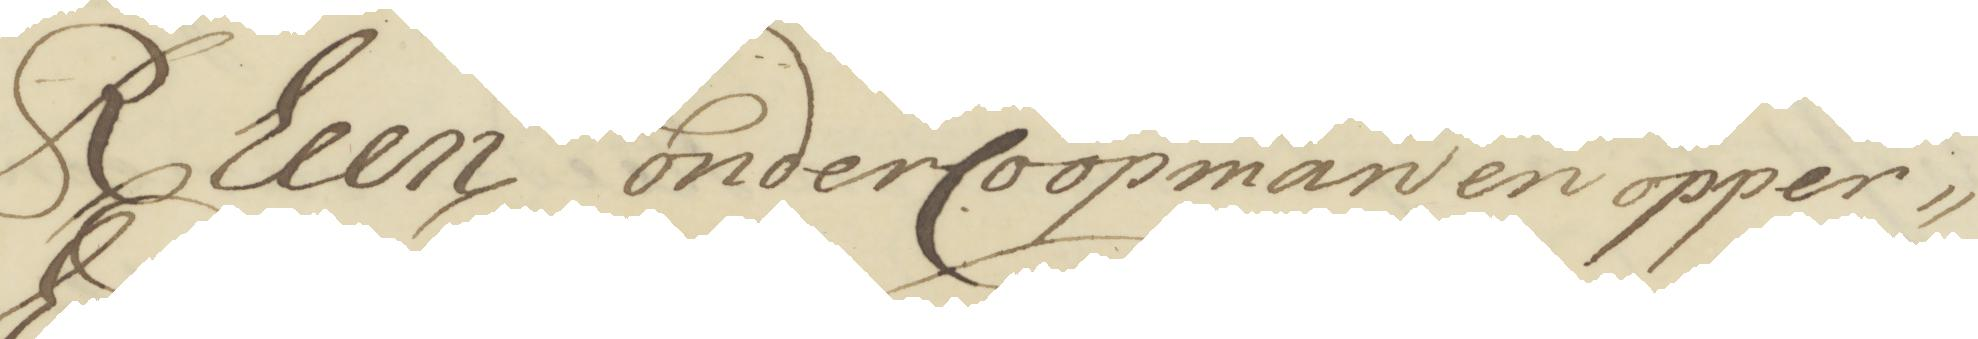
Rheen ondercoopman en opper„
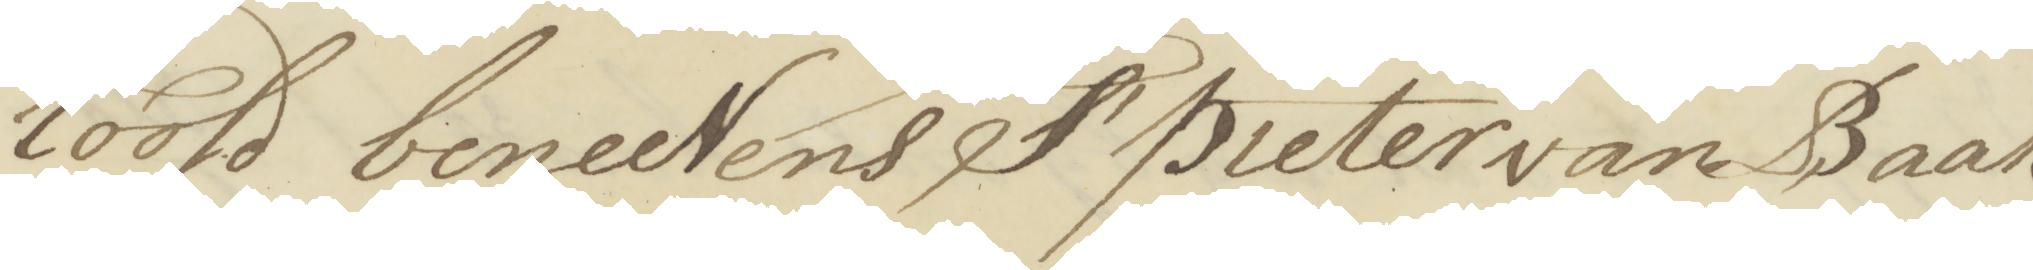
hoofd beneevens S' Pieter van Baak
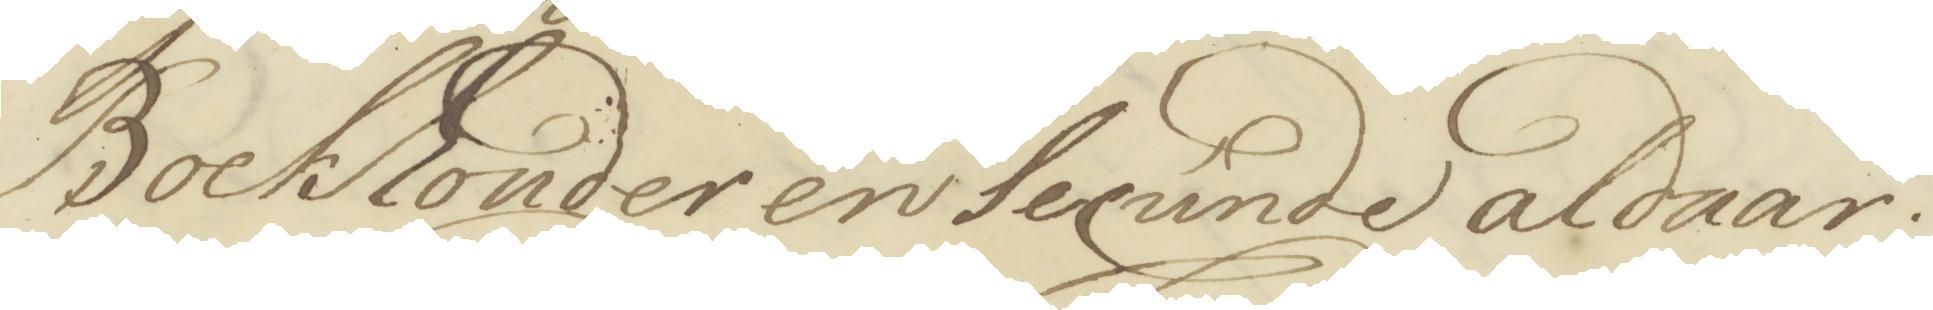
Boekhouder en secunde aldaar.
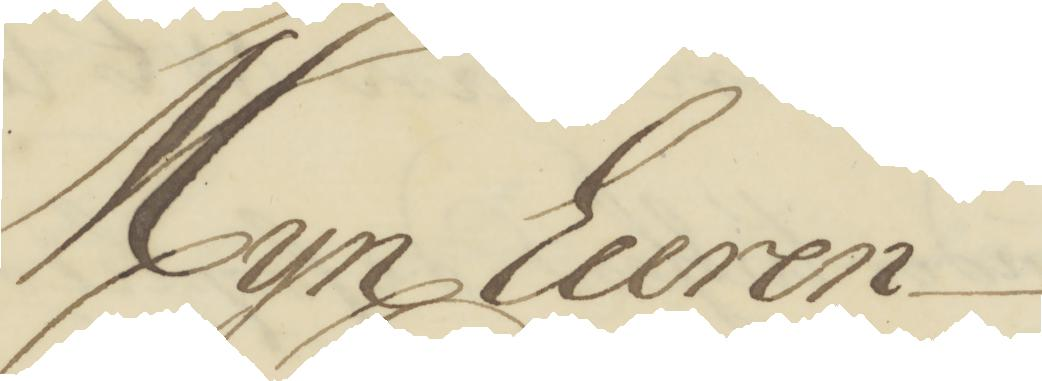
Myn heeren
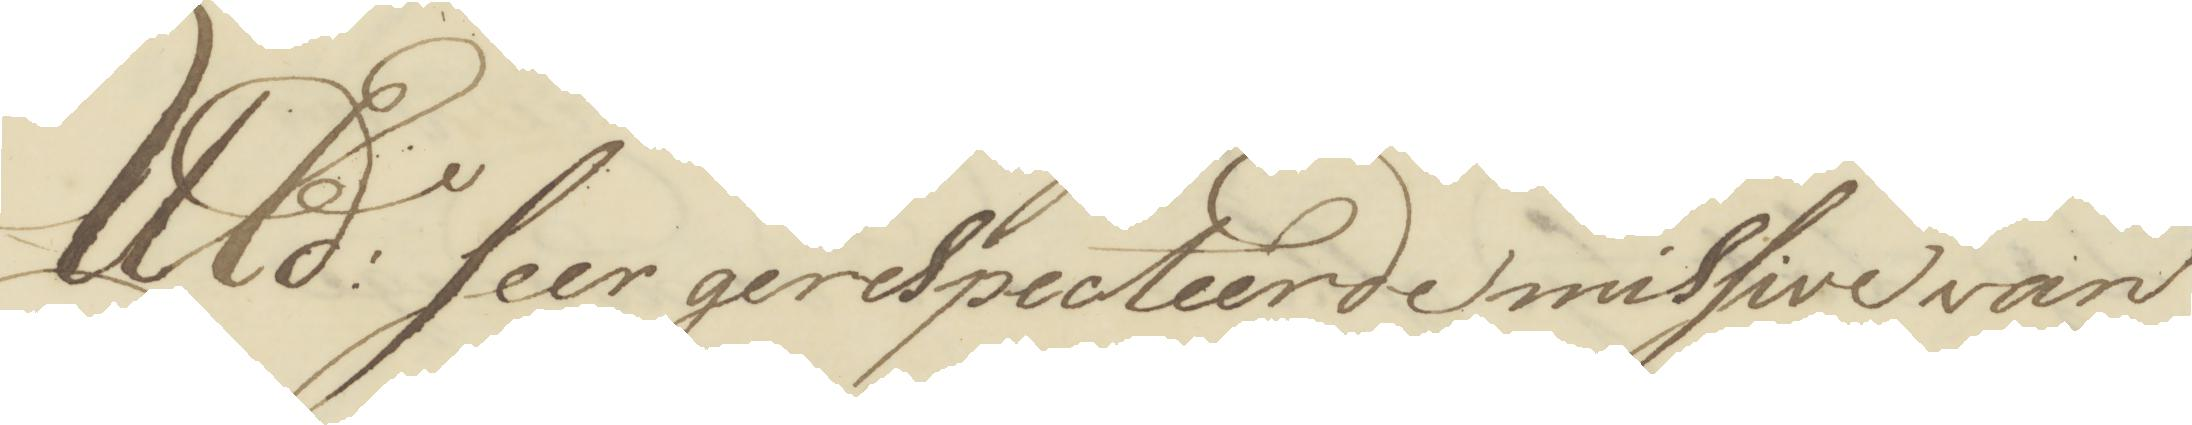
UEd:e seer gerespecteerde missive van
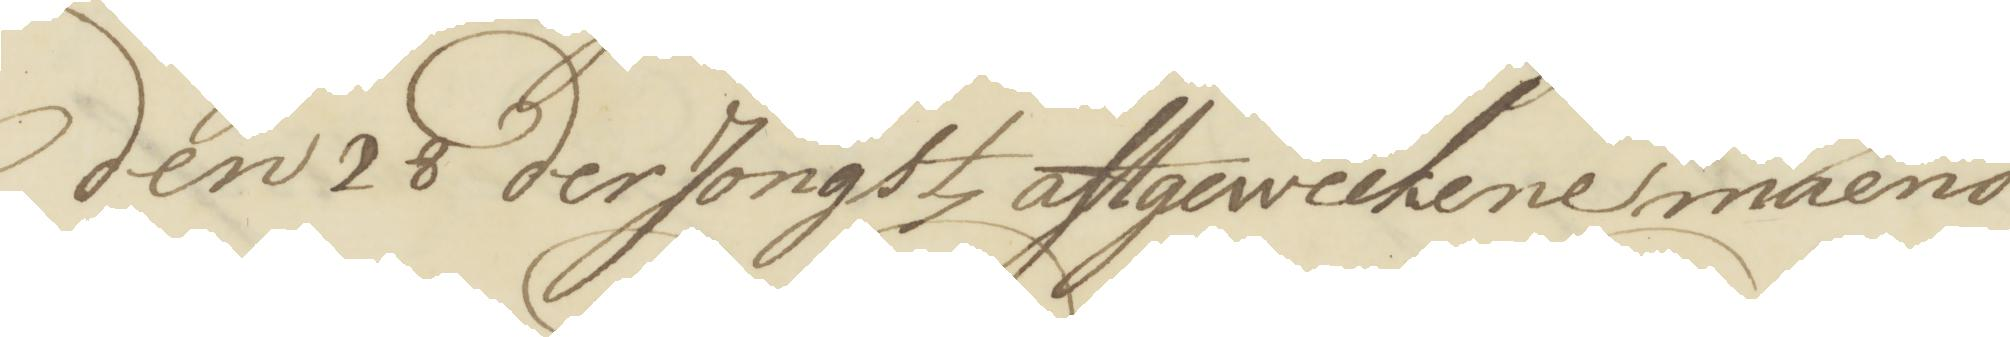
den 28 der jongst aftgeweekene maend
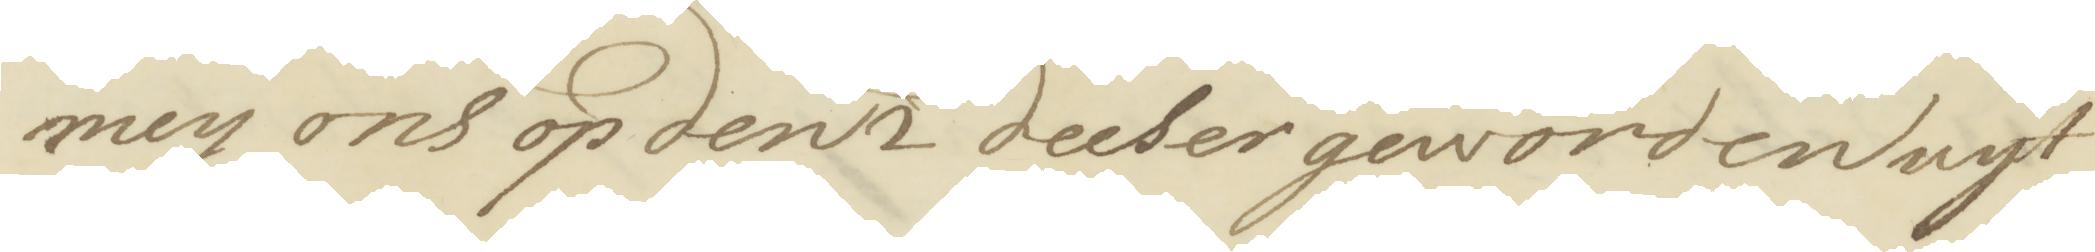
mey ons op den 2 deeser geworden uyt
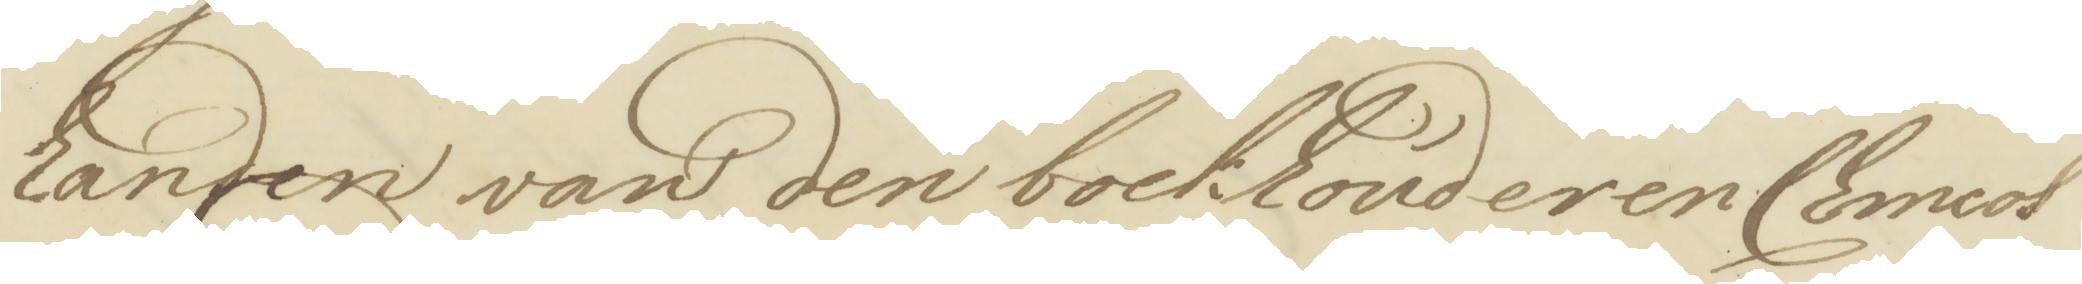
handen van den boekhouder en Chincos
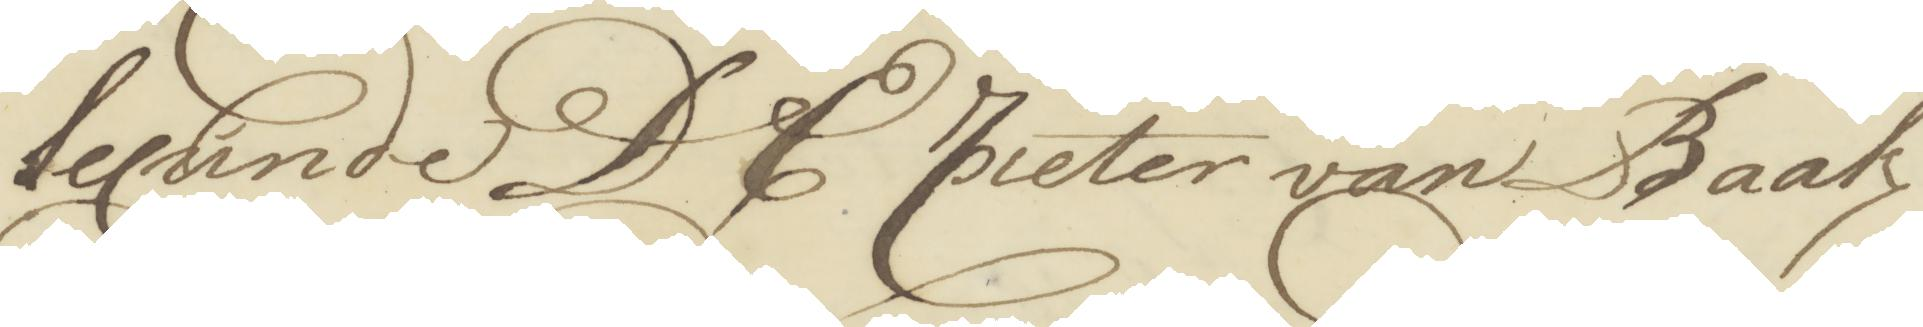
secunde D E pieter van Baak
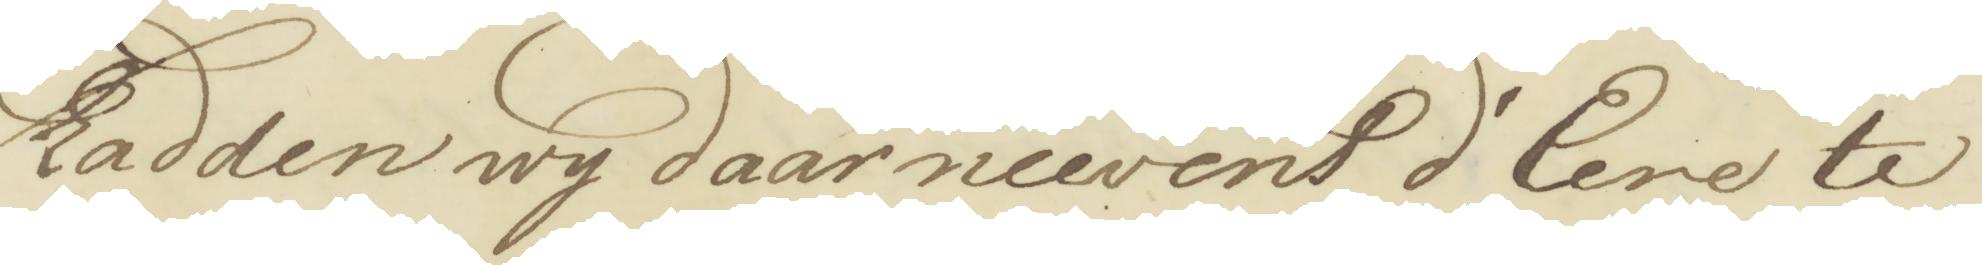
hadden wy daar neevens d’ Eere te
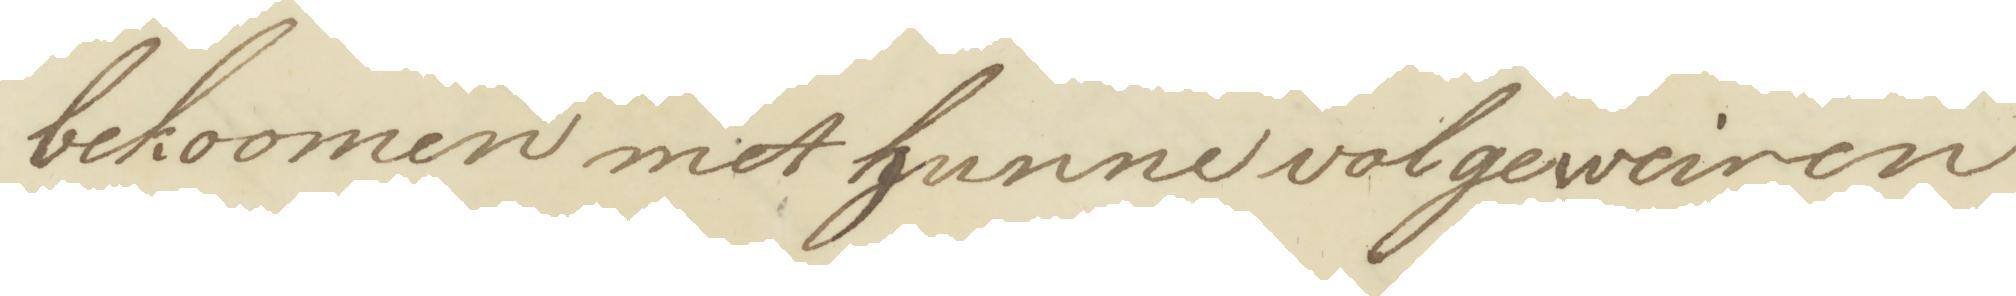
bekoomen met hunne volgeweiren
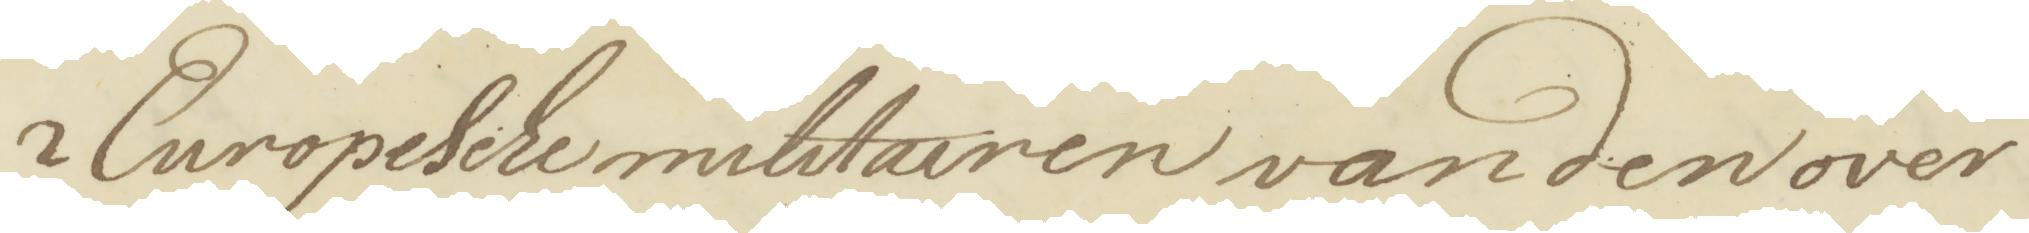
2 Europesche mititairen van den over
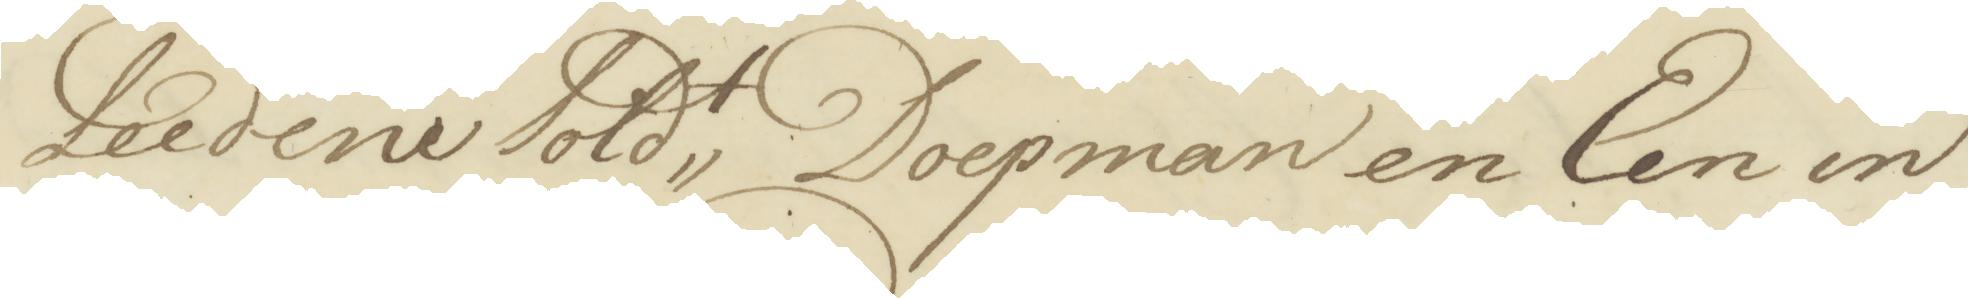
leedene sold„t Doepman en Een in
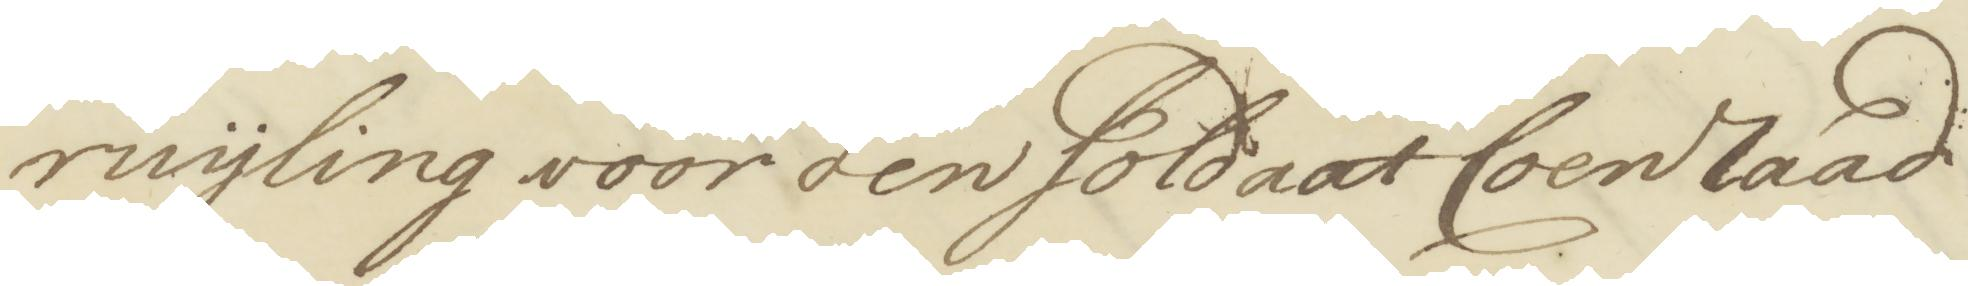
ruijling voor den soldaat Coenraad
